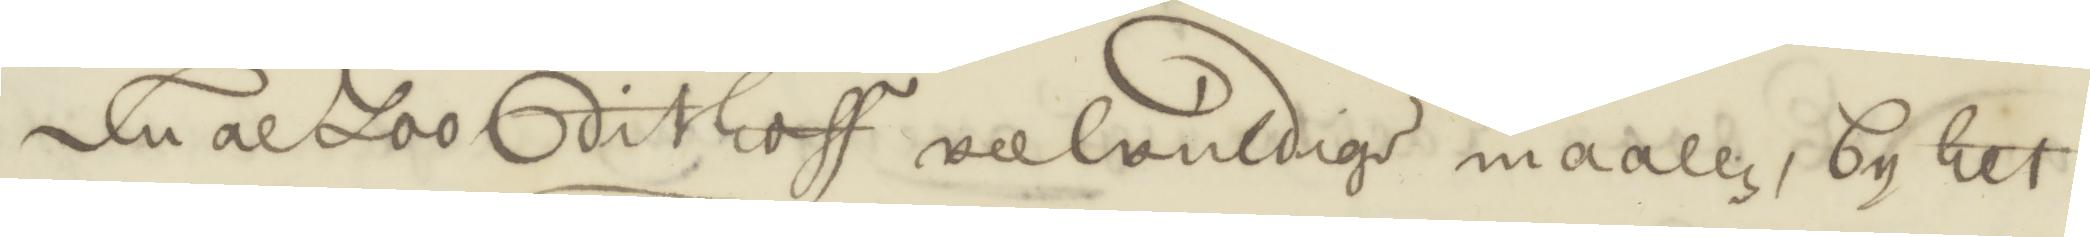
En alzoo dit hoff veelvuldige maalen, by het
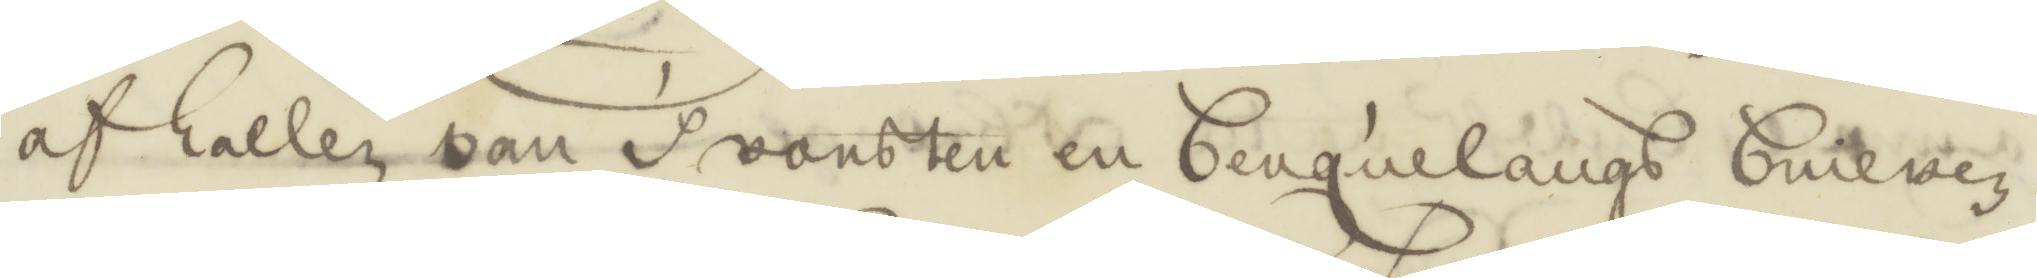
afhaelen van 's vorsten en berquelangs brieven
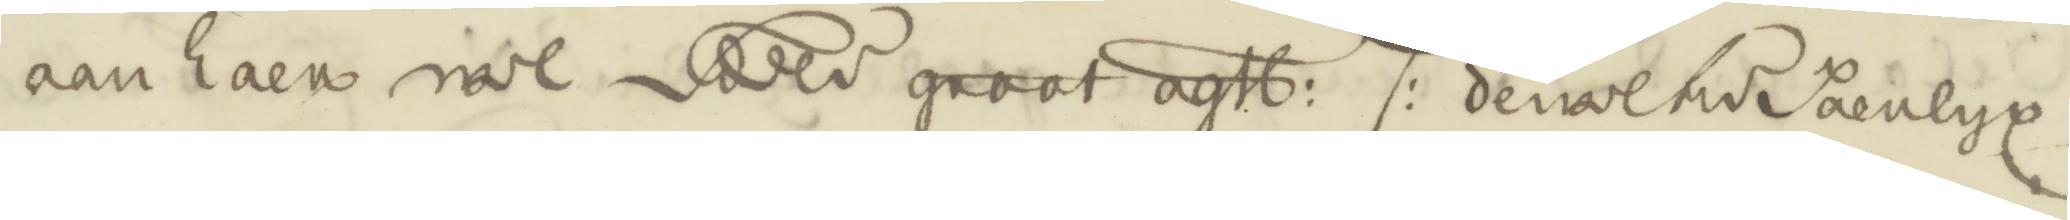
aan haer wel Edele groot agtb: /: dewelke Jaerlyx
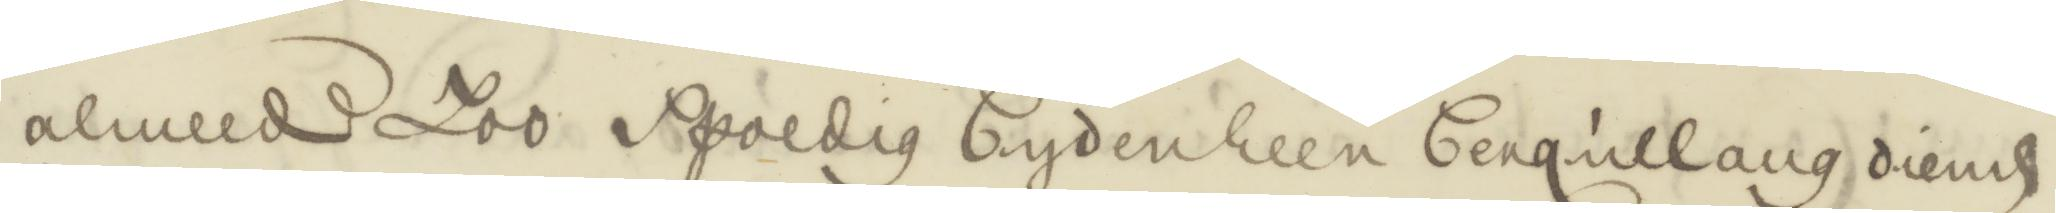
almeede zoo spoedig byden heer berquelang dienen
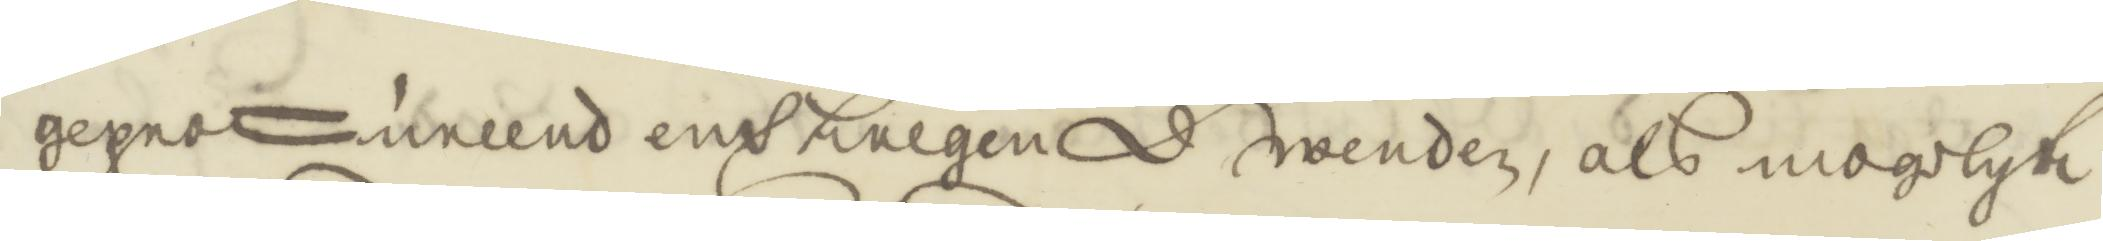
geprocureerd en verkregen te werden, als mogelyk
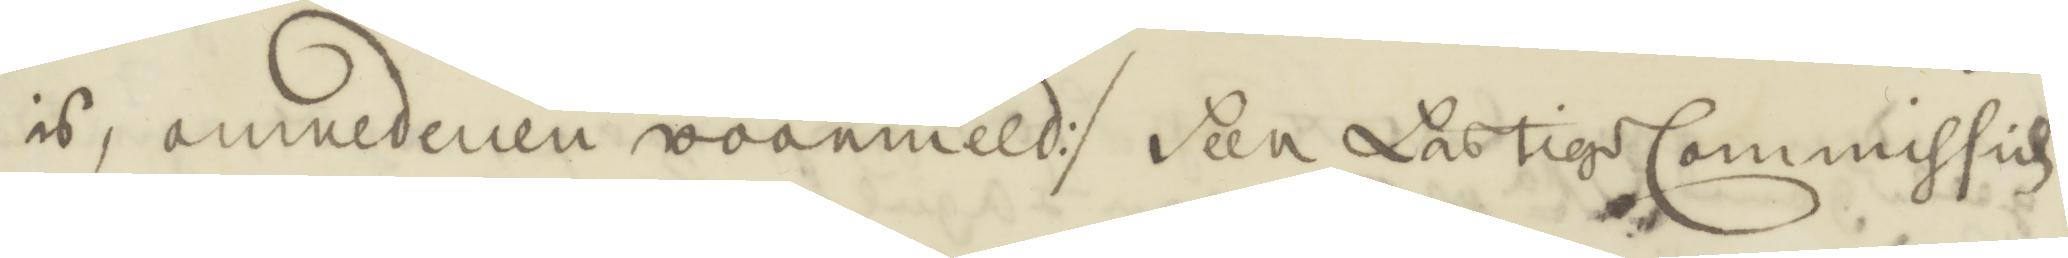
is, omredenen voormeld:/ seer Lastige Commissien
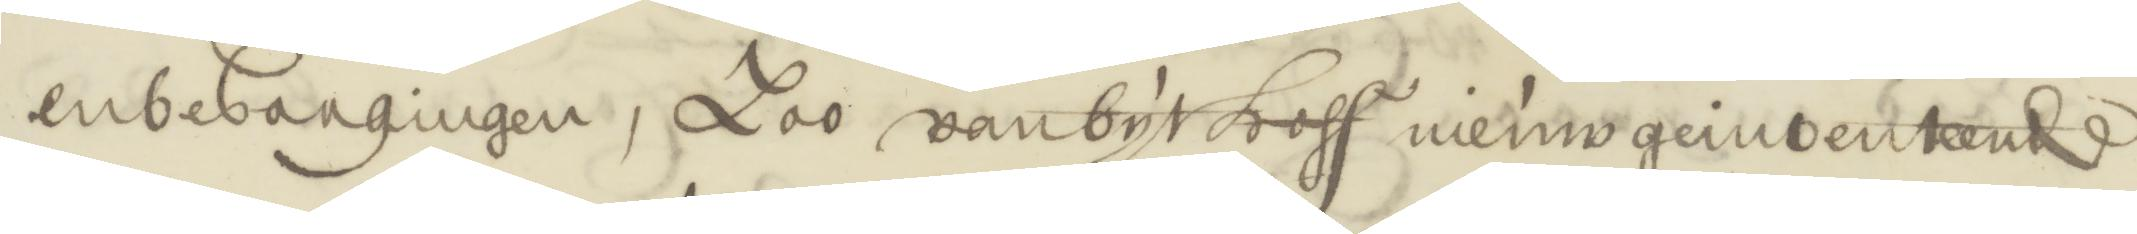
en besorgingen, zoo van bij't hoff nieuw geinventeerde
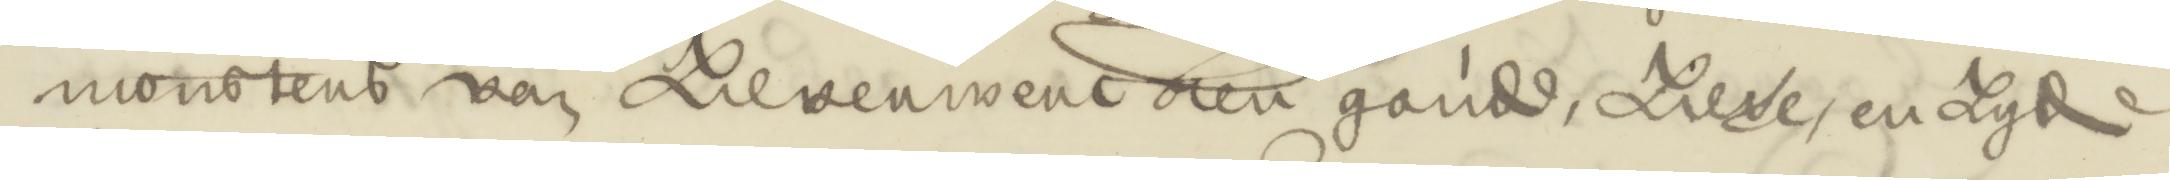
monsters van zilverwercken goude, zilvere, en zyde
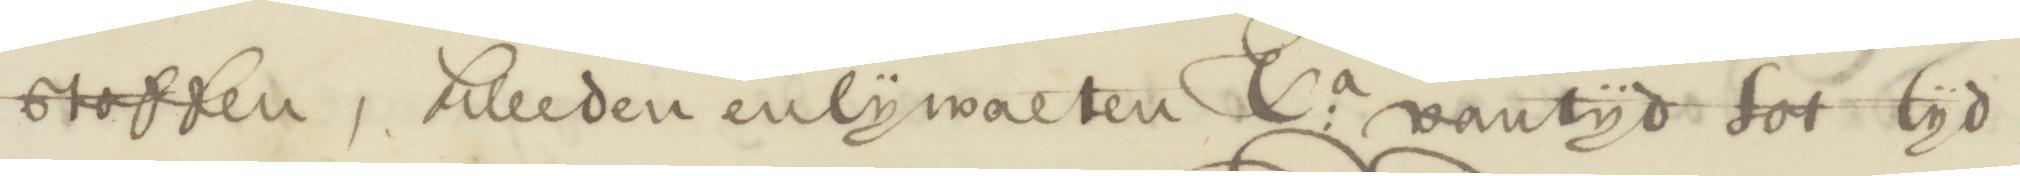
stoffen, kleeden en lijwaeten &:a van tijd tot tijd
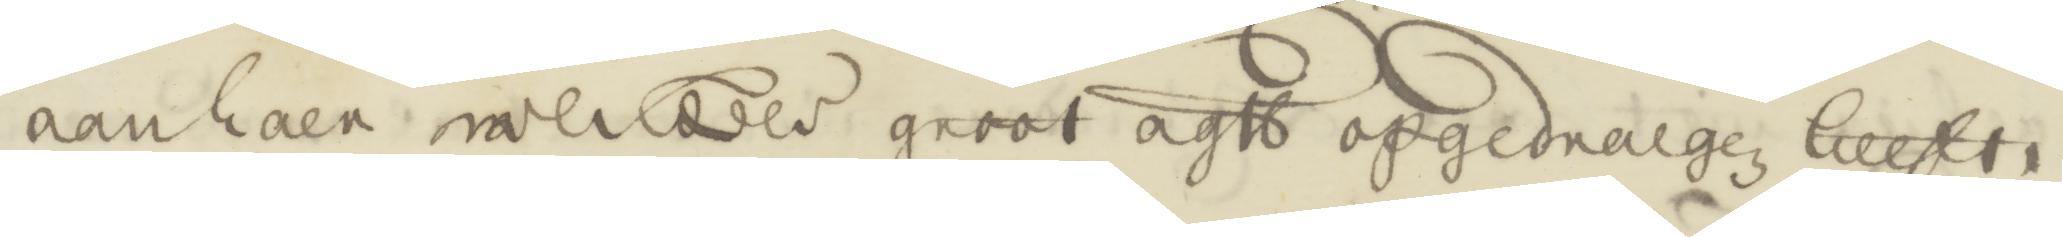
aan haer wel Edele groot agtb opgedraegen heeft
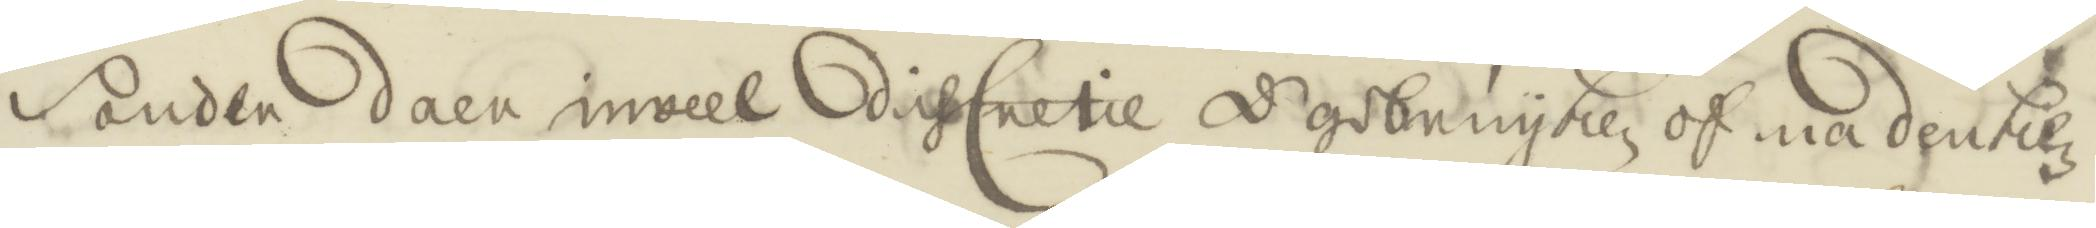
sonder daer inveel discretie te gebruijken of na denken
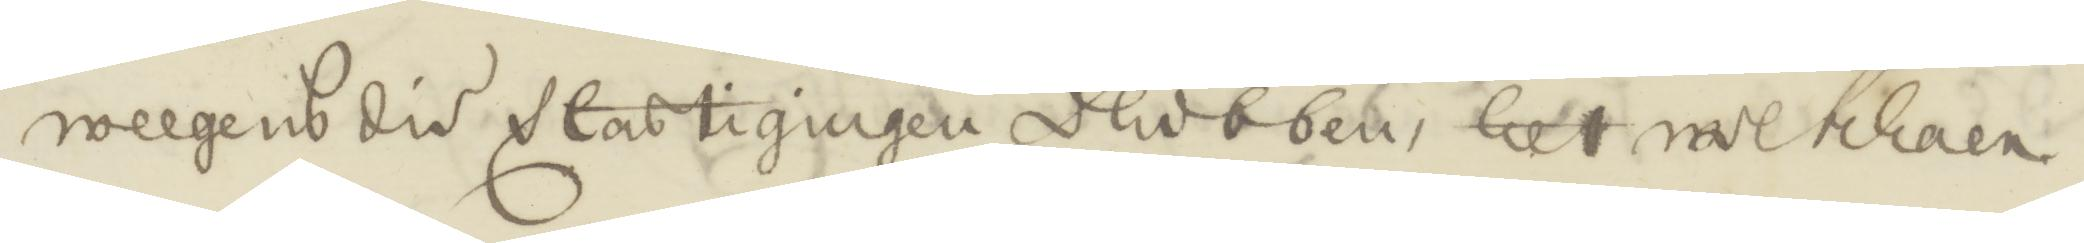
weegens die verlastigingen te hebben, het welk haer
